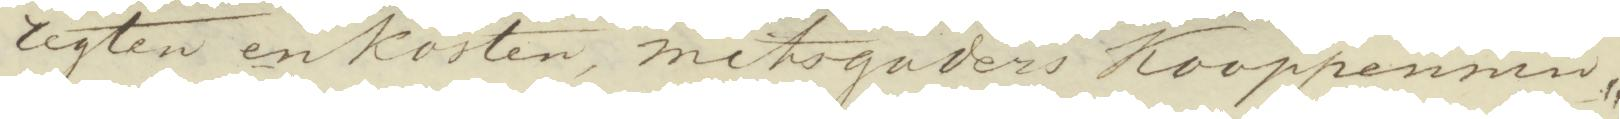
regten en kosten, mitsgaders Kooppennin„
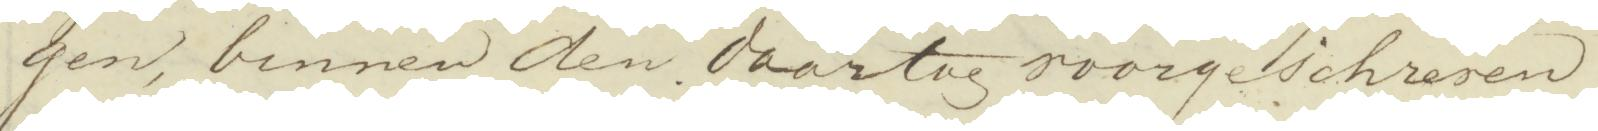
gen, binnen den daartoe voorgeschreven
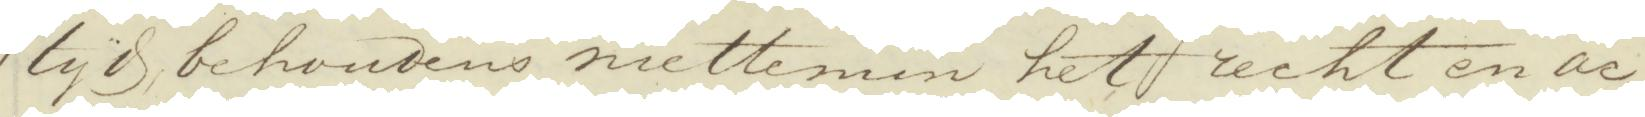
tijd, behoudens niettemin het recht en ac
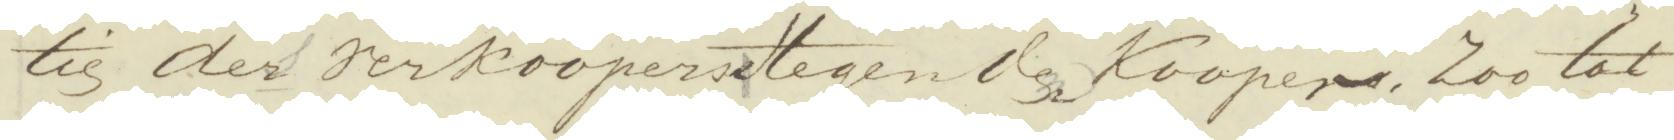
tie der verkoopers tegende Koopers, zoo tot
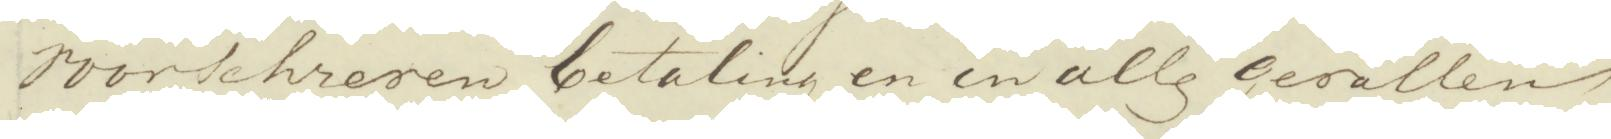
voorschreven betaling en in alle gevallen,
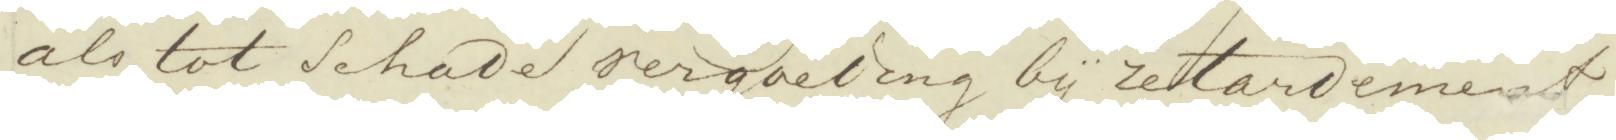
als tot schade vergoeding bij retardement
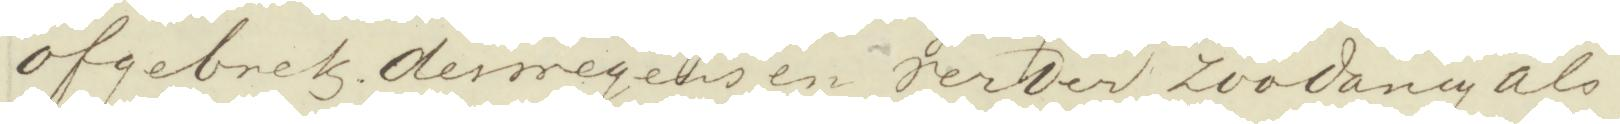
of gebrek, deswegens en verder zoodanig als
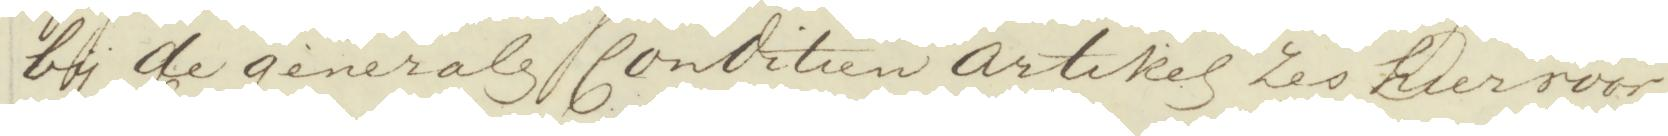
bij de generale Conditien artikel zes hiervoor
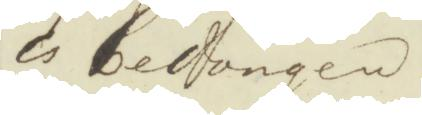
is bedongen
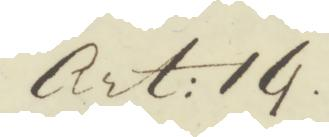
Art: 14.
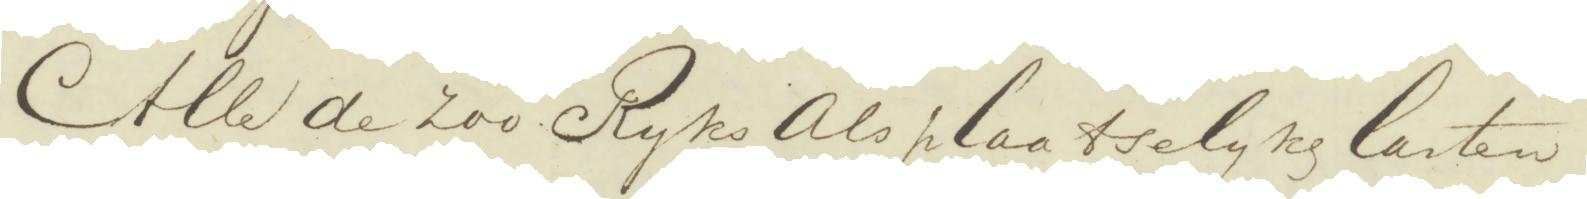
Alle de zoo Ryks als plaatselyke lasten
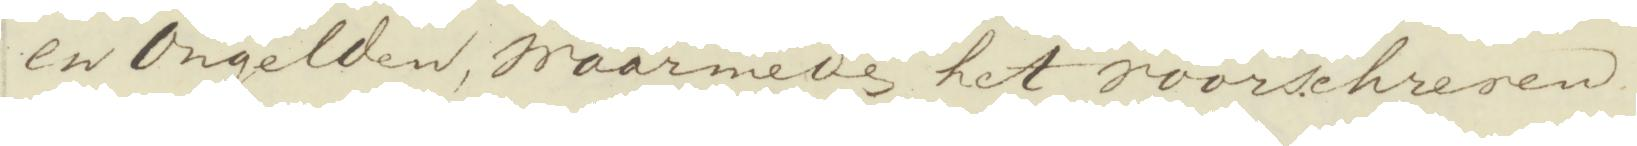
en ongelden, waarmede het voorschreven
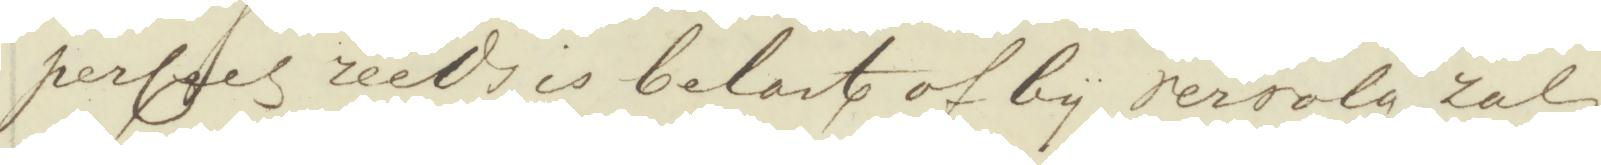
perceel reeds is belast of bij vervolg zal
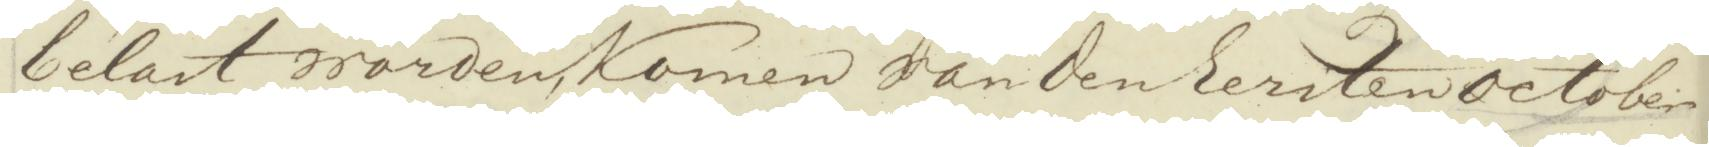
belast worden, komen van den Eersten october
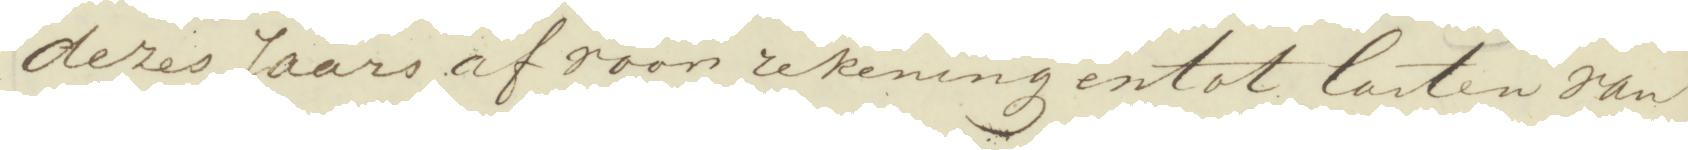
dezes Jaars af voor rekening en tot lasten van
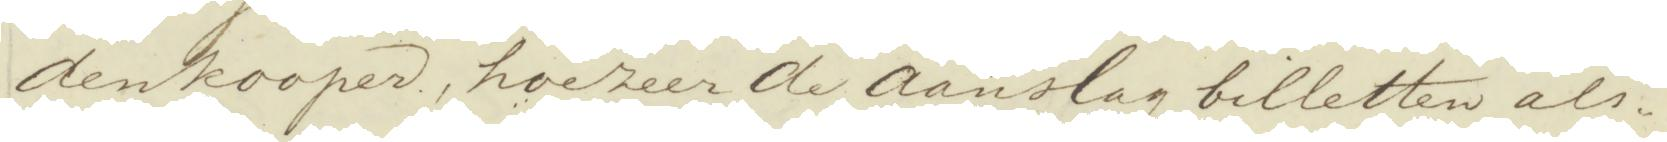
den kooper, hoezeer de aanslag billetten als„
